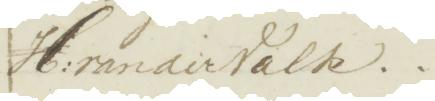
H: van der Valk.
